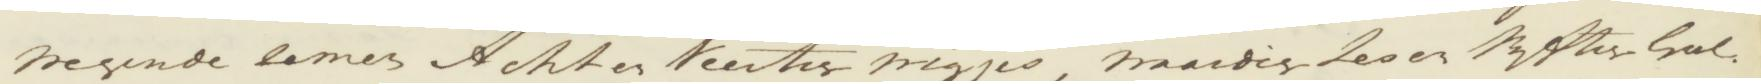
wegende zamen Acht en Veertig wigjes, waardig Zes en Vyftig Gul„
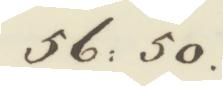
56: 50.
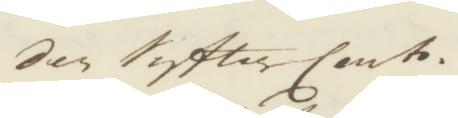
den Vijftig Cent.
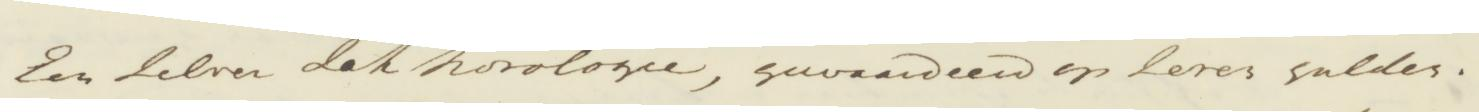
Een zilver Zak Horologie, gewaardeerd op zeven gulden.
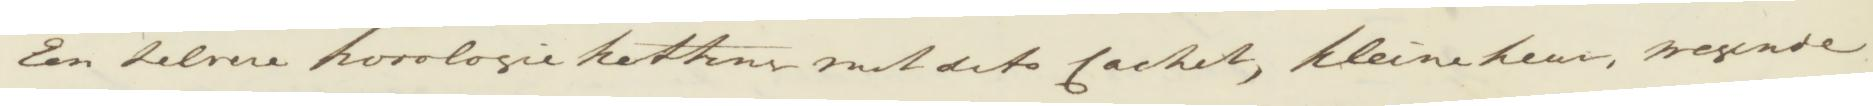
Een zilvere horologieketting met dito Cachet, kleine keur, wegende
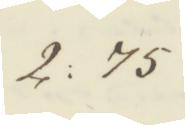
2: 75
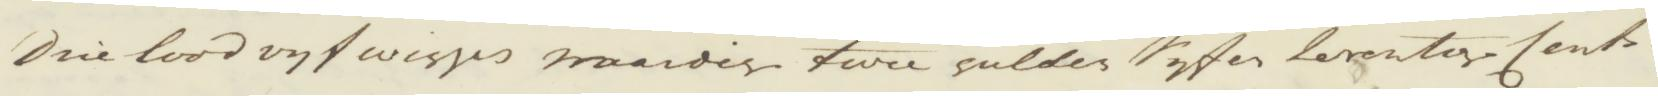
drie lood vyf wigjes waardig twee gulden Vyf en Zeventig Cent.
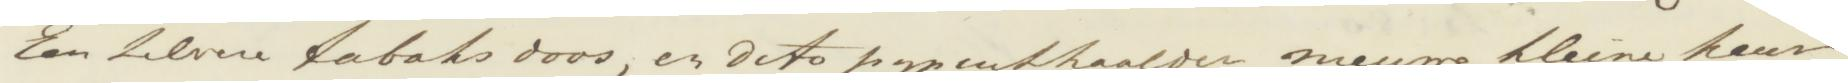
Een zilvere tabaks doos, en dito pypuithaalder nieuwe kleine keur,
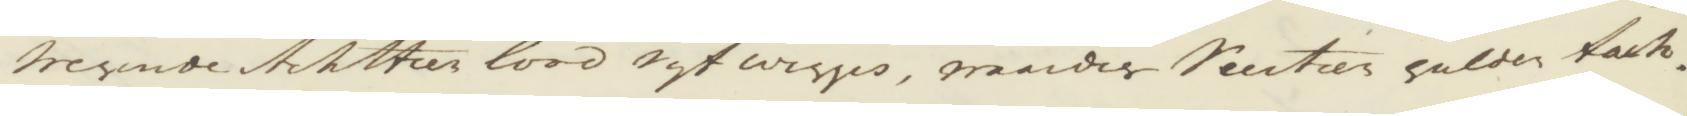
wegende Achttien lood vyf wigjes, waardig Veertien gulden tach„
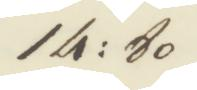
14: 80
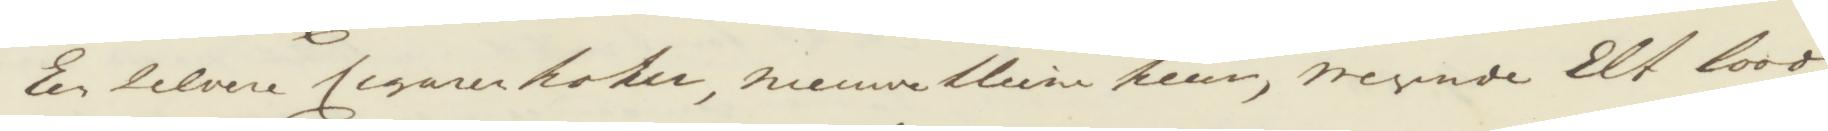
Een zilvere Cigaren koker, nieuwe kleine keur, wegende Elf lood
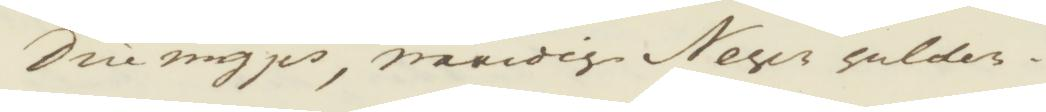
Drie wigjes, waardig Negen gulden.
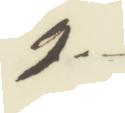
9.—
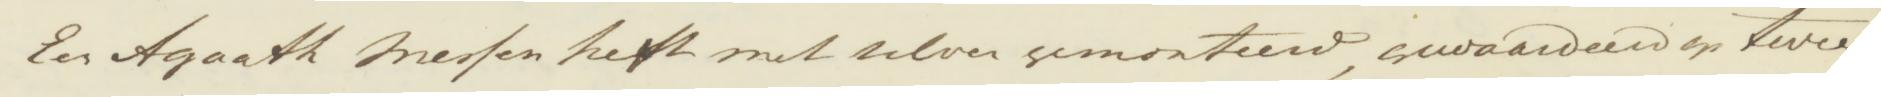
Een Agaath messen heft met zilver gemonteerd, gewaardeerd op twee
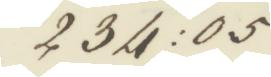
234:05
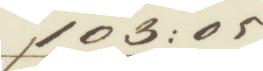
103: 05
